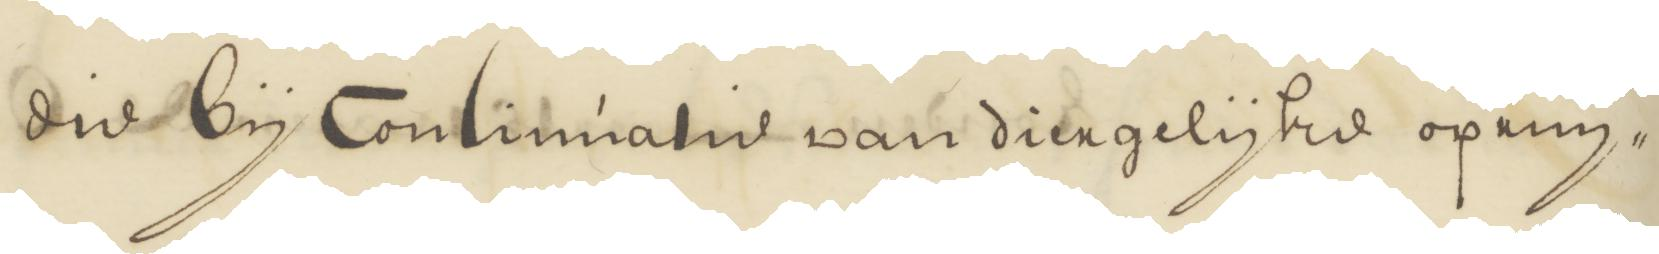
die bij continuatie van dier gelijke opruij„
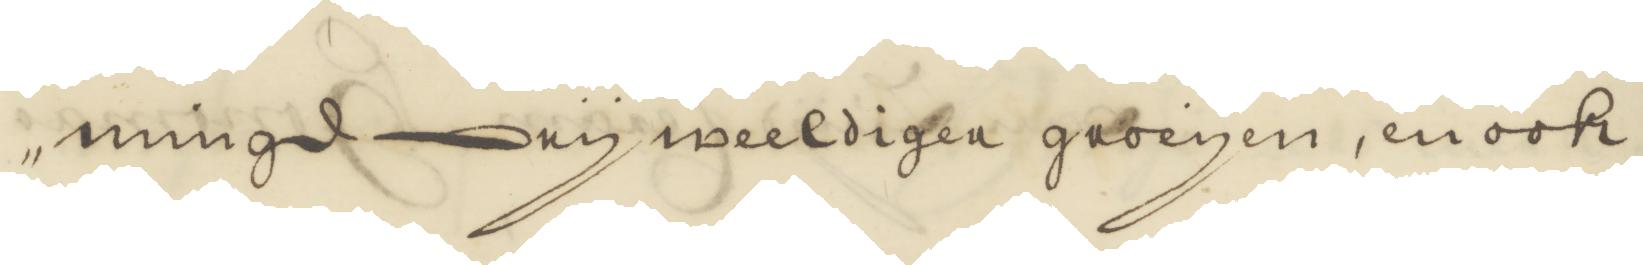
„ minge vrij weeldiger groeijen, en ook
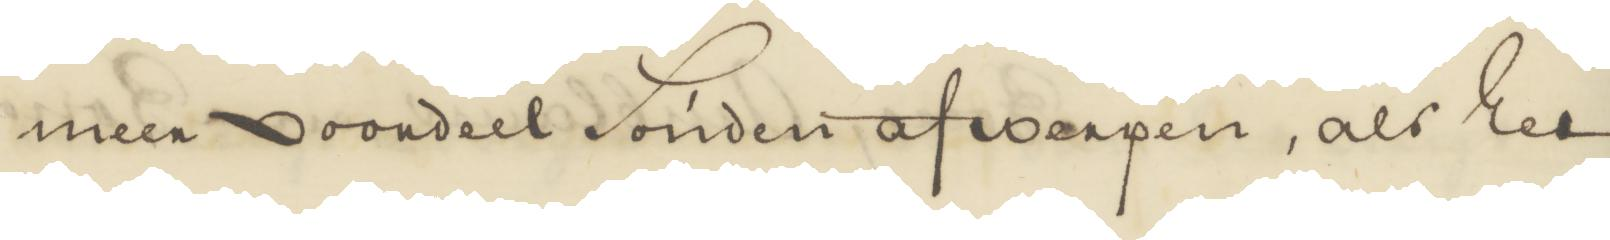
meer voordeel souden afwerpen, als het
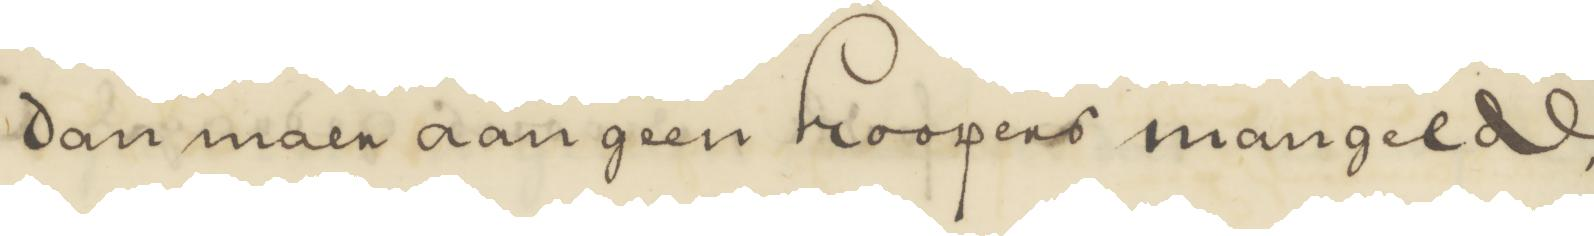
dan maer aan geen koopers mangelde,
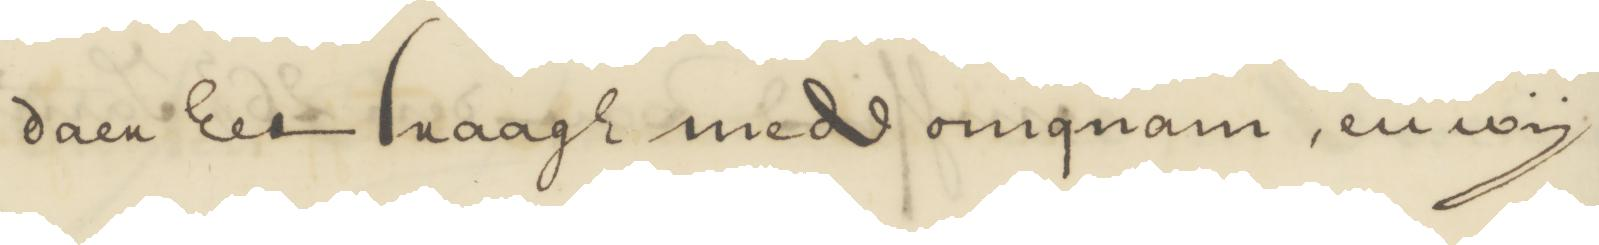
daer het traagh mede omquam, en wij
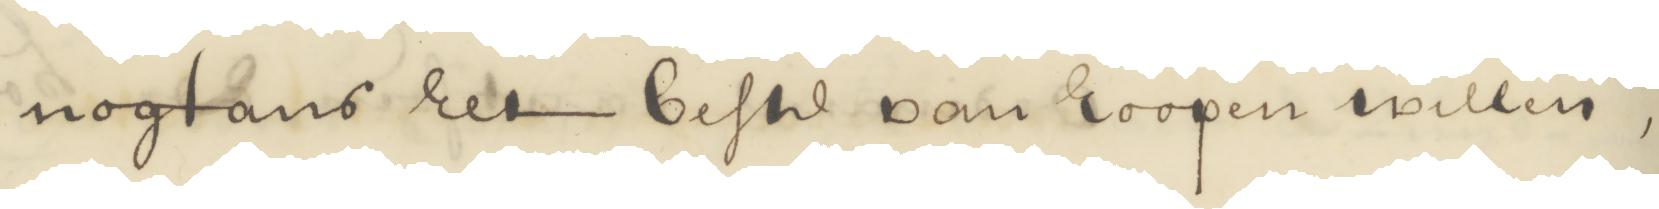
nogtans het beste van hoopen willen,
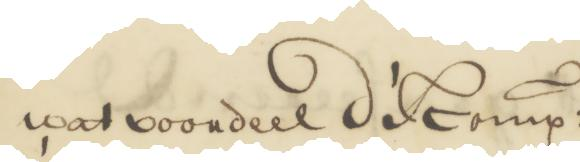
wat voor deel d’ Ecomp:
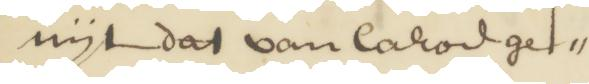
uijt dat van lahoe ge„
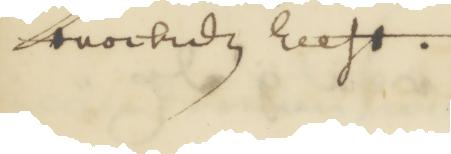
trocken heeft.
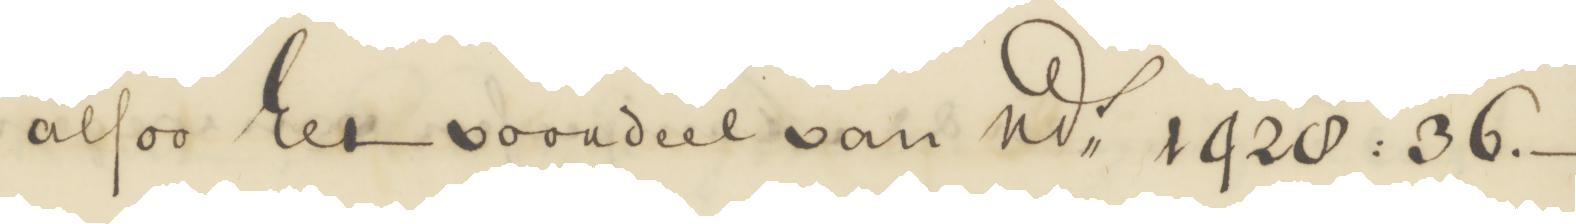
alsoo het voor deel van ud„s 1428:36.
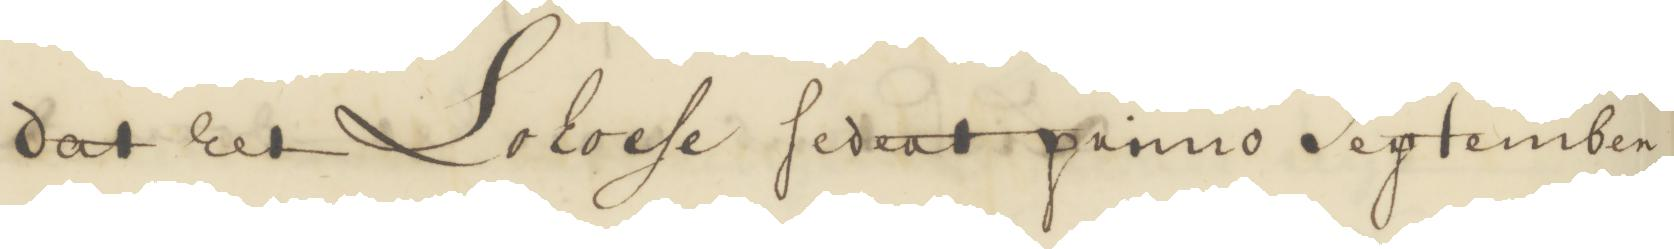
dat het Lohoese sedert primo September,
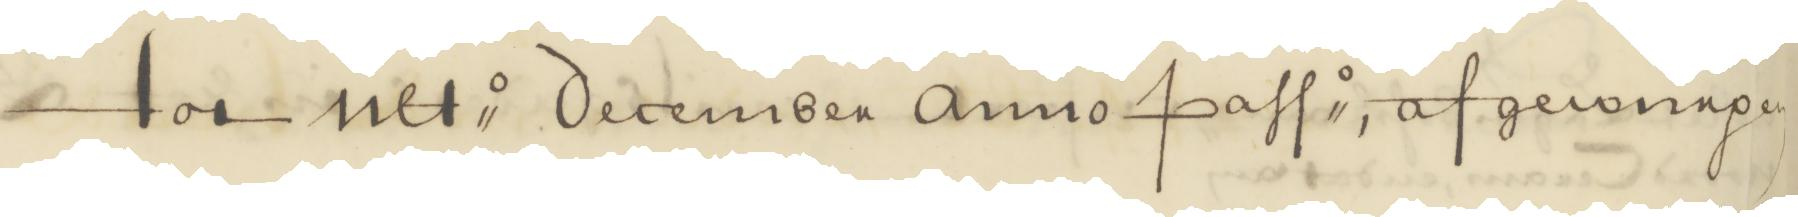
tot ult„o december Anno pass„o, afgewurpen
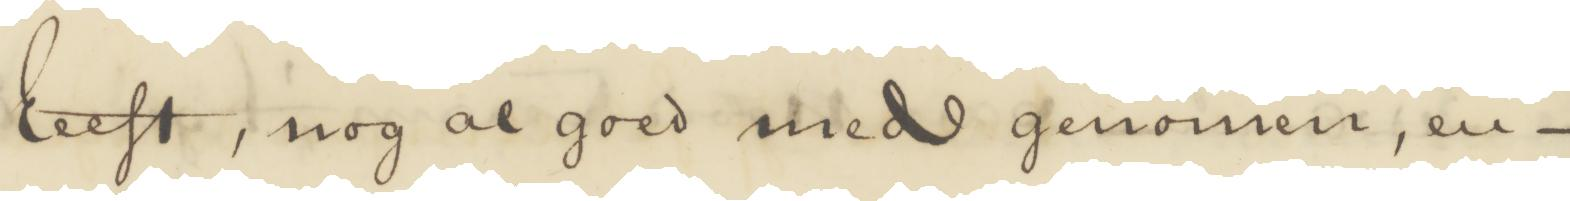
heeft, nog al goed mede genomen, en
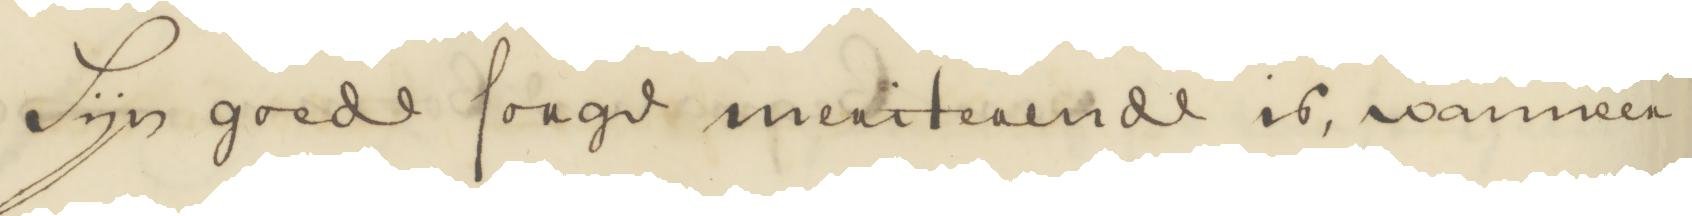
sijn goede sorge meriteaende is, wanneer
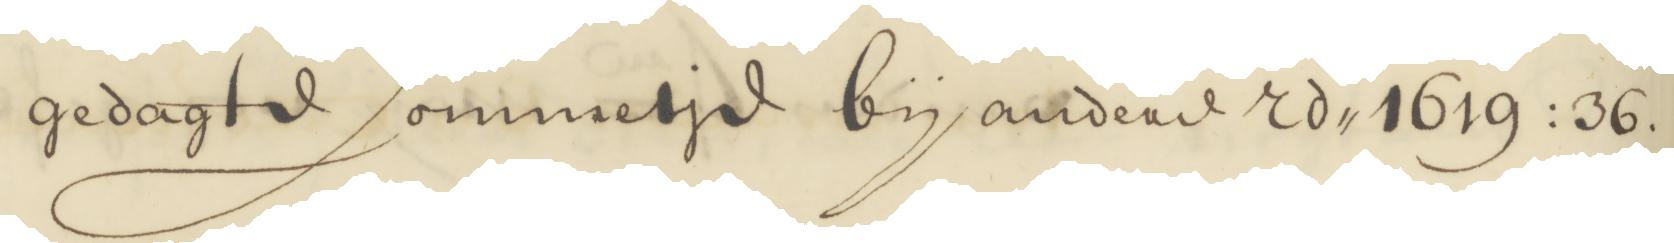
gedagte Sommetje bij andere rd„s 1619 :36.
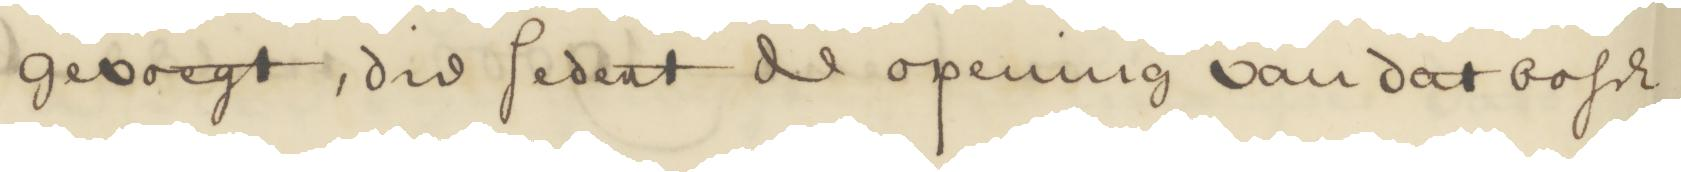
gevoegt, die sedert de opening van dat bosch
